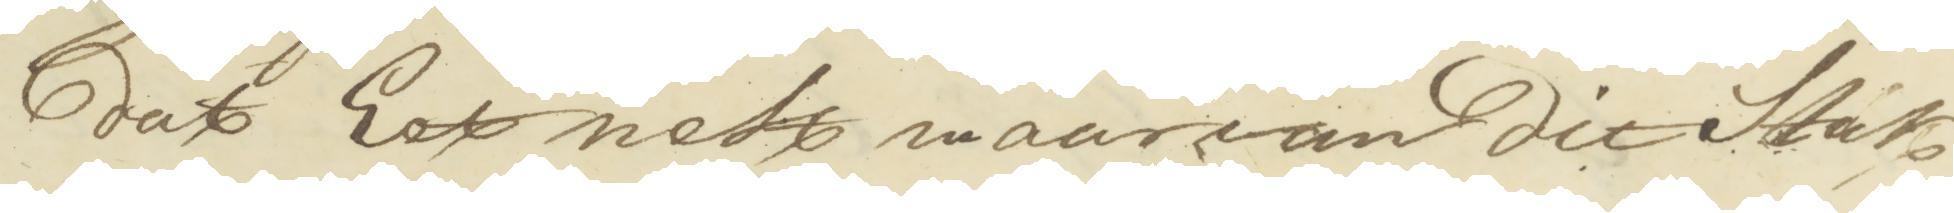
dat het nest waar van dit stuk
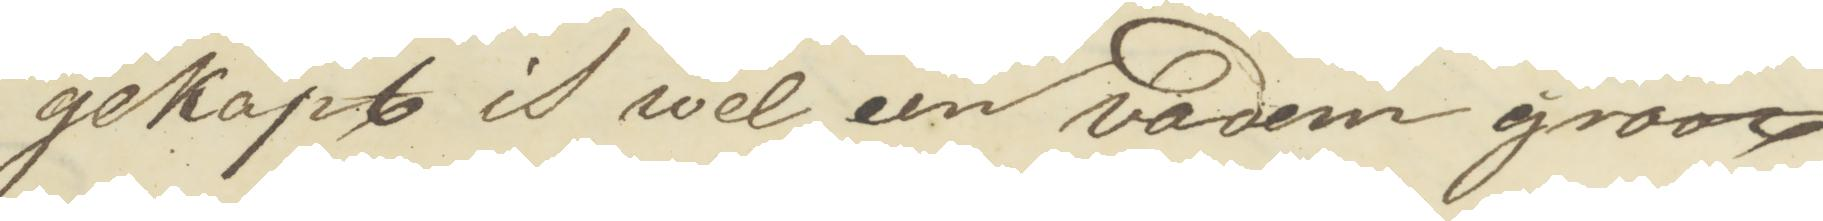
gekapt is wel een vadem groot
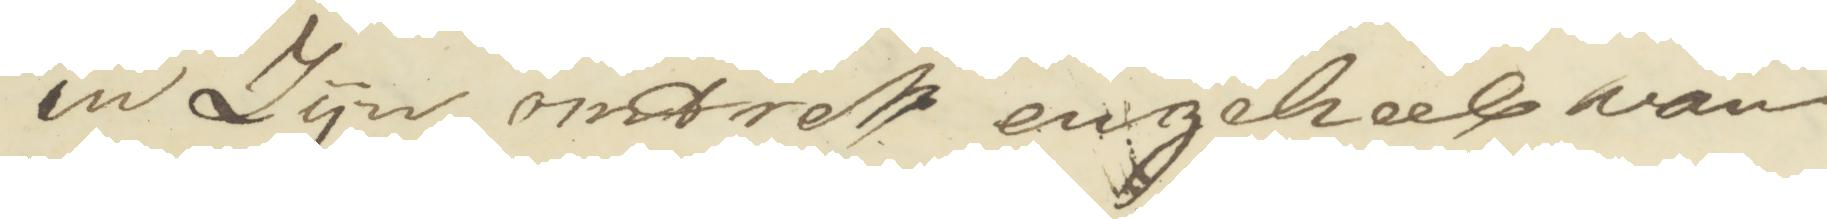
in zijn omtrek en geheel na
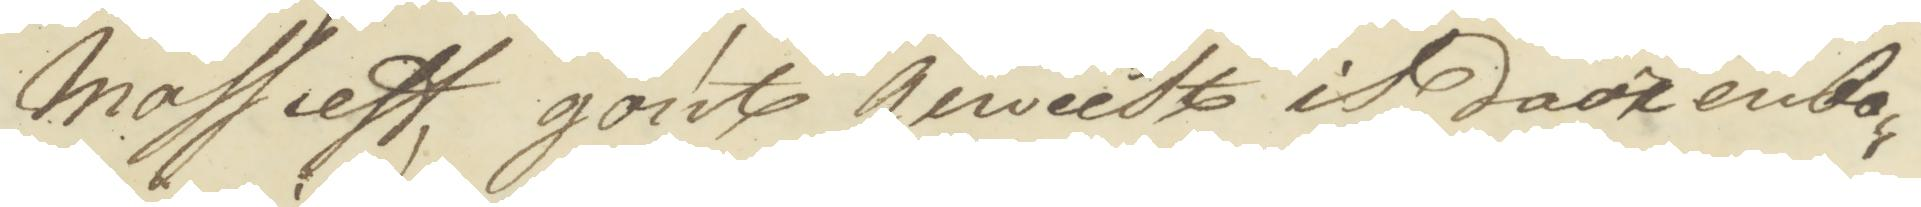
Massieff gout geweest is daar enbo„
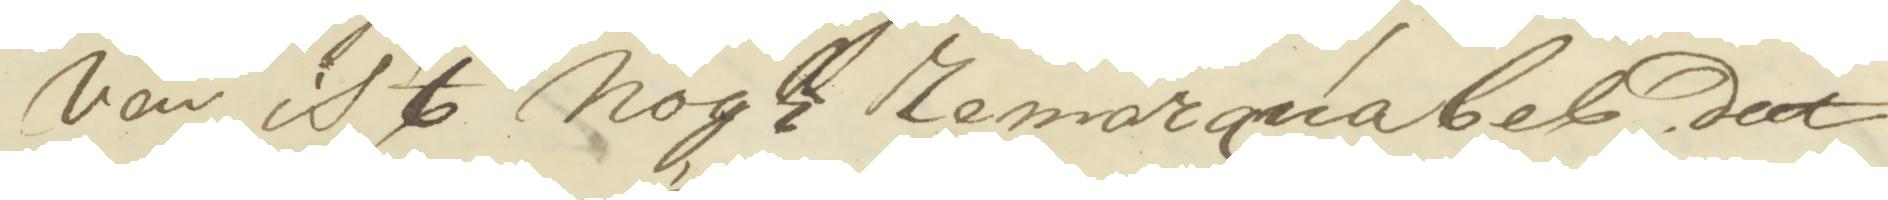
ven is 't nogh remarquabel dat
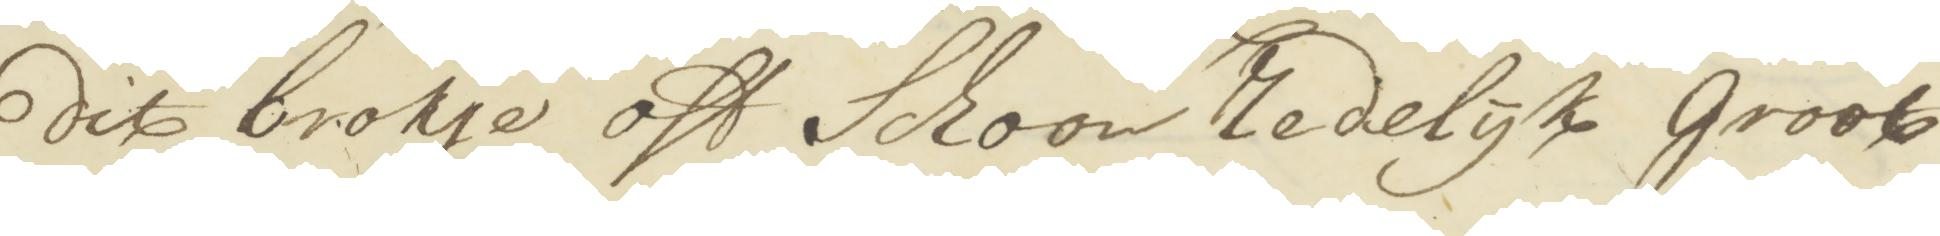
dit brokje oft schoon redelijk groot
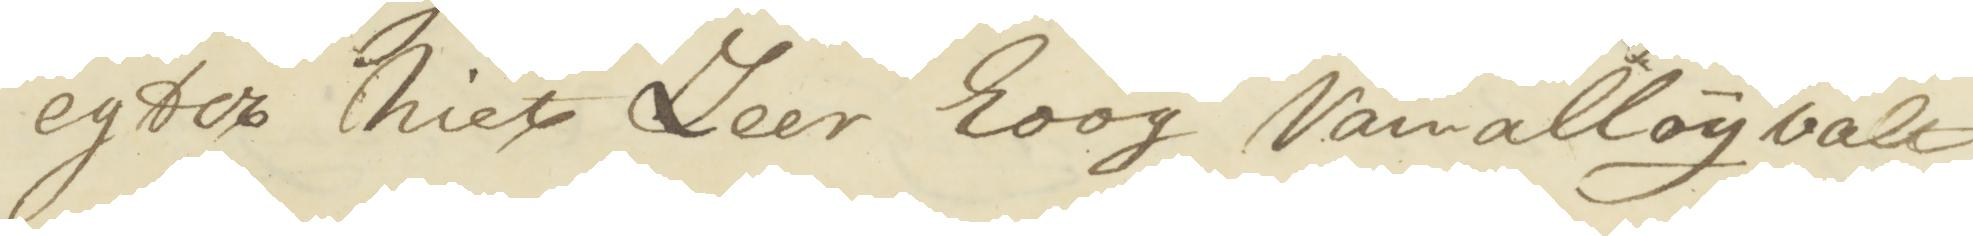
egter niet zeer hoog van alloij valt
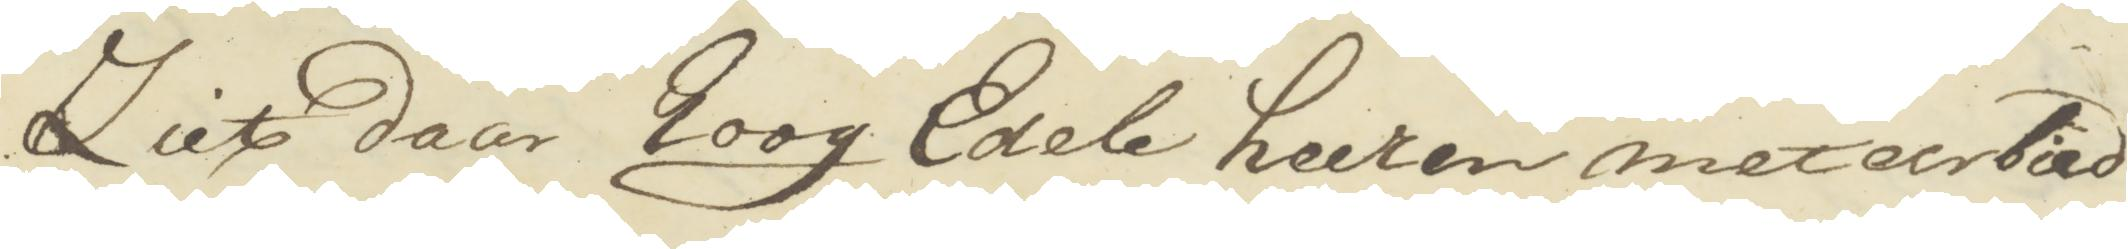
Ziet daar Hoog Edele heeren met eerbied
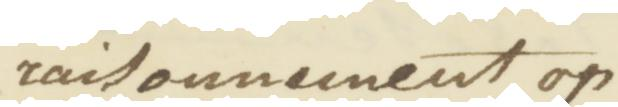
raisonnement op
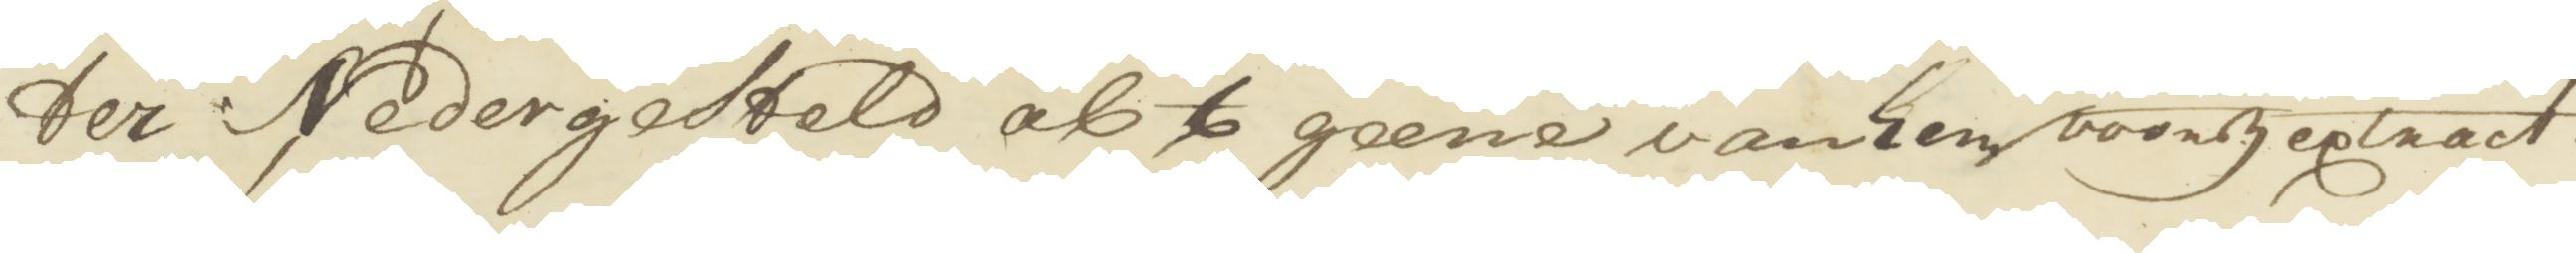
der Nedergesteld al ’t geene van hem voorsz extract
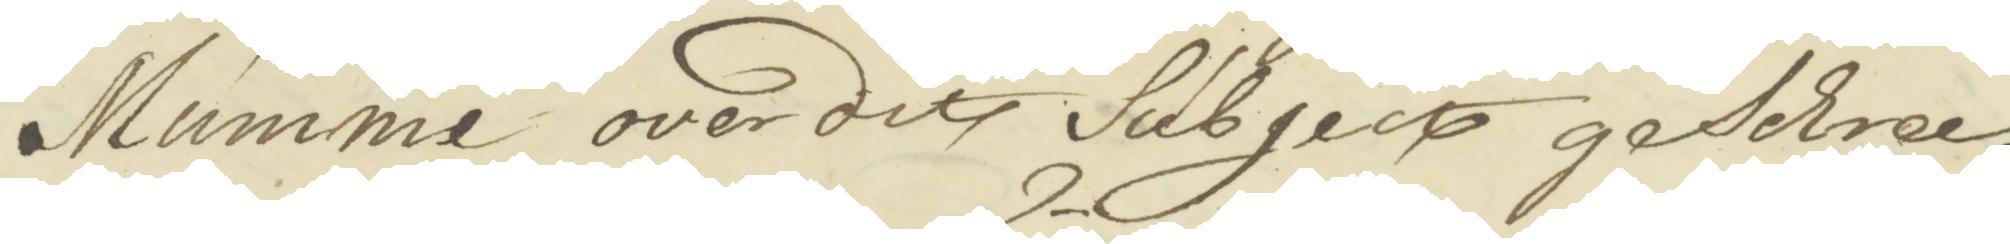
Mumme over dit subject geschree
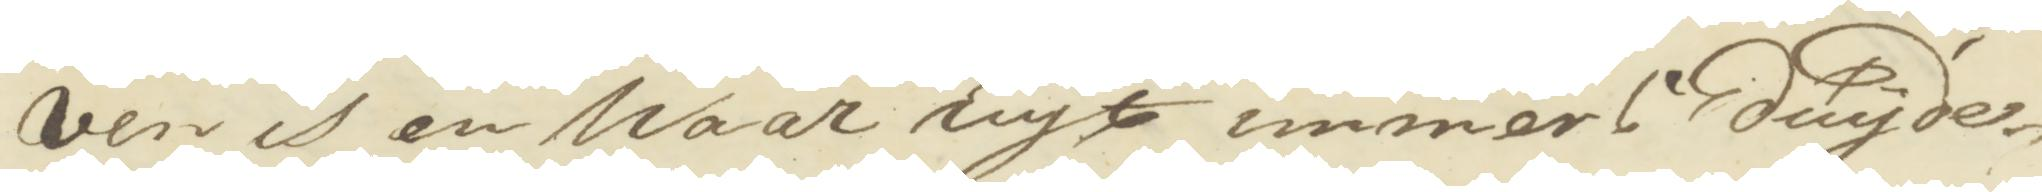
ven is en waar uijt immers duijde„
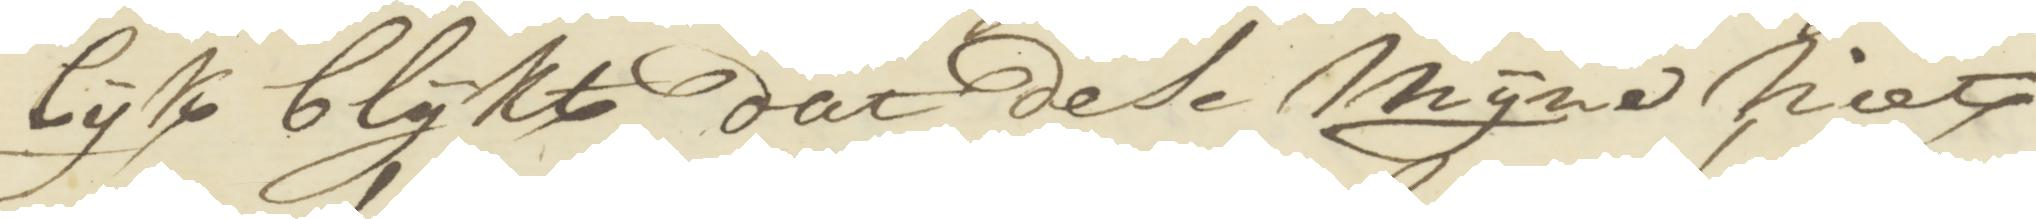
lijk blijkt dat dese mijne niet
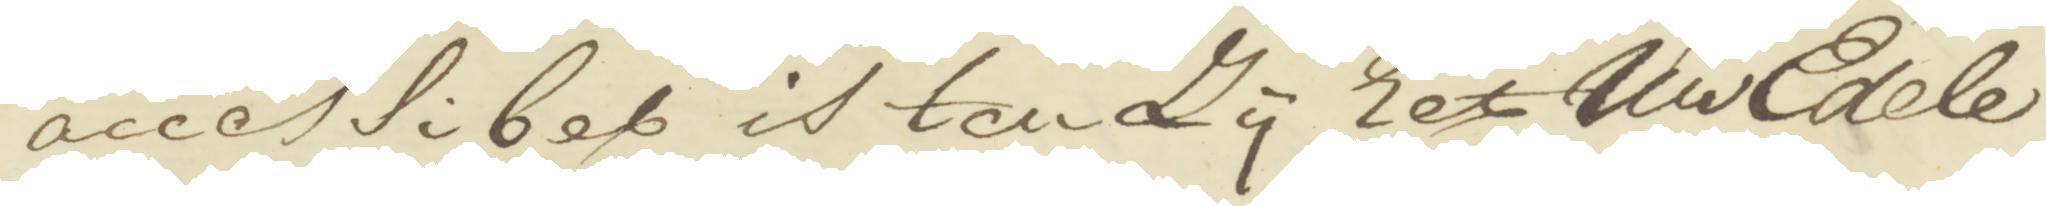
accessibel is ten zij het Uw Edele
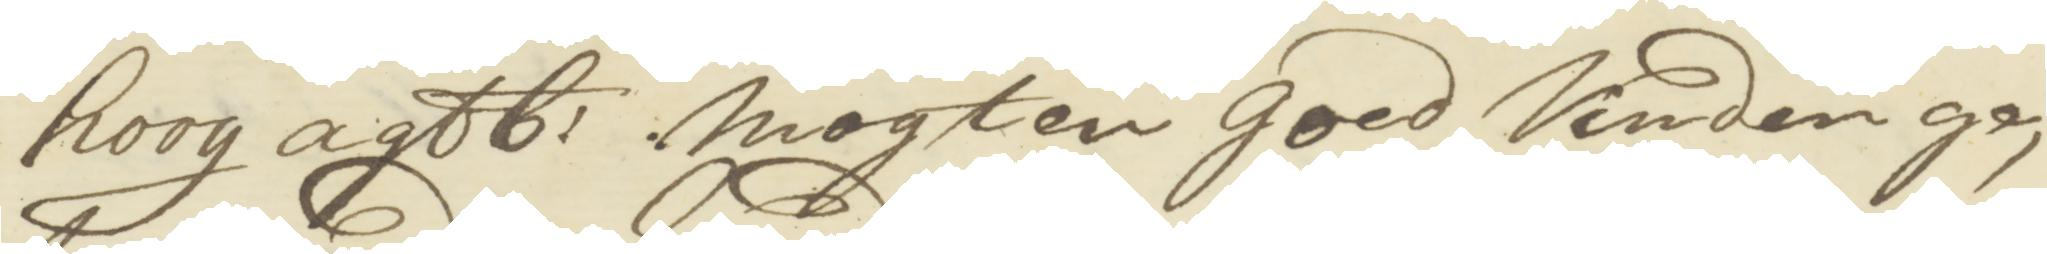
Hoog Agtb: mogten goed vinden ge,
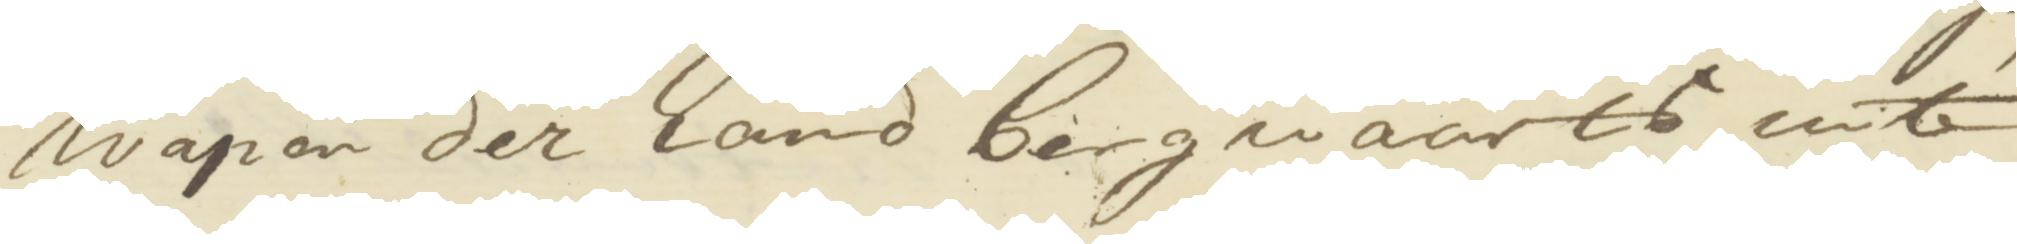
wapen der hand bergwaarts in te
